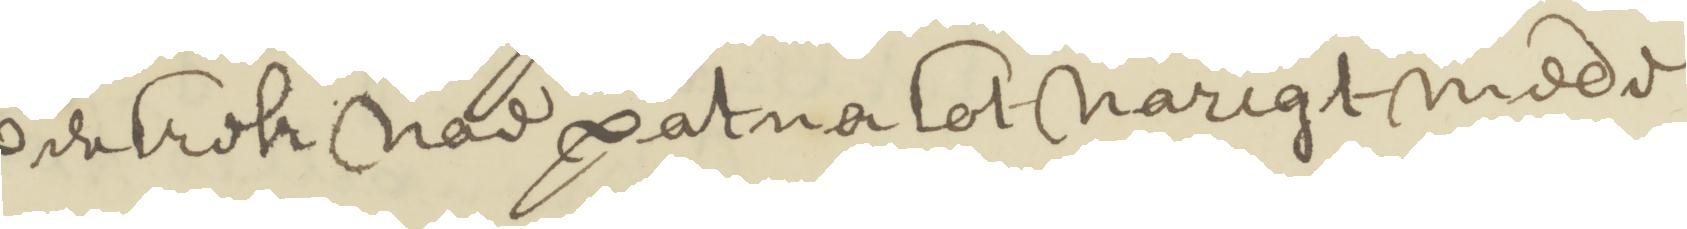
vertrek nae patna tot narigt mede
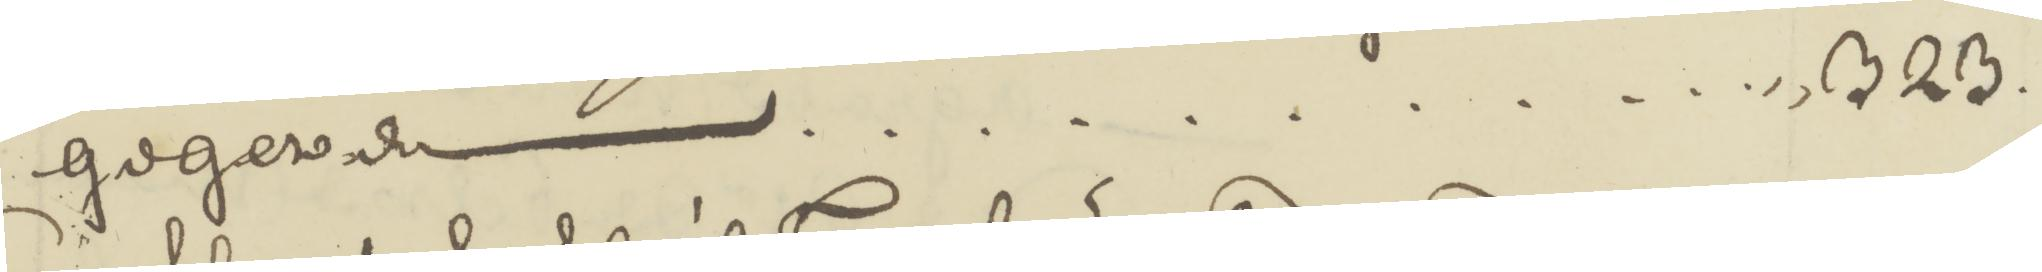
gegeven - - - - - - - - - - - „ 323.
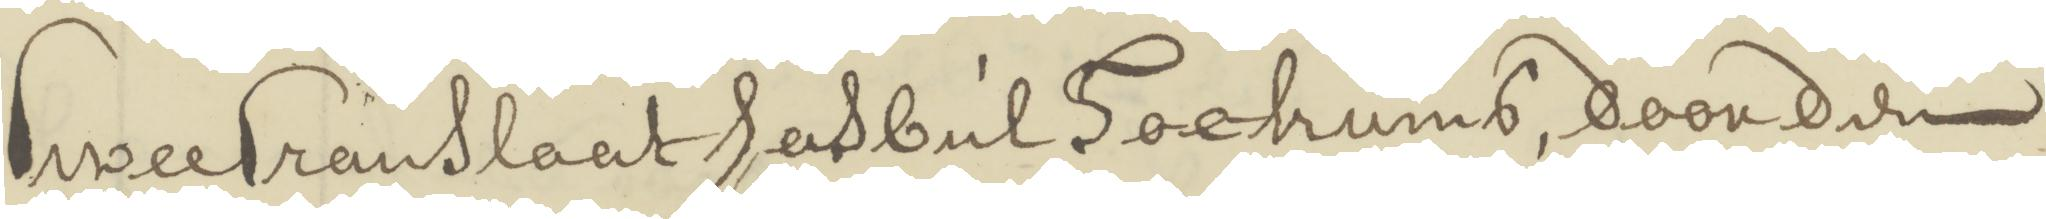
twee translaat hasbul Hockums, door den
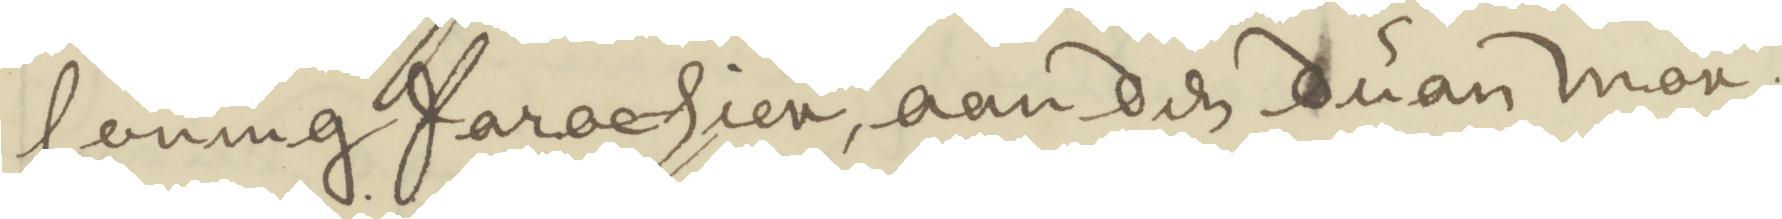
Coning farochier, aan den duan mor
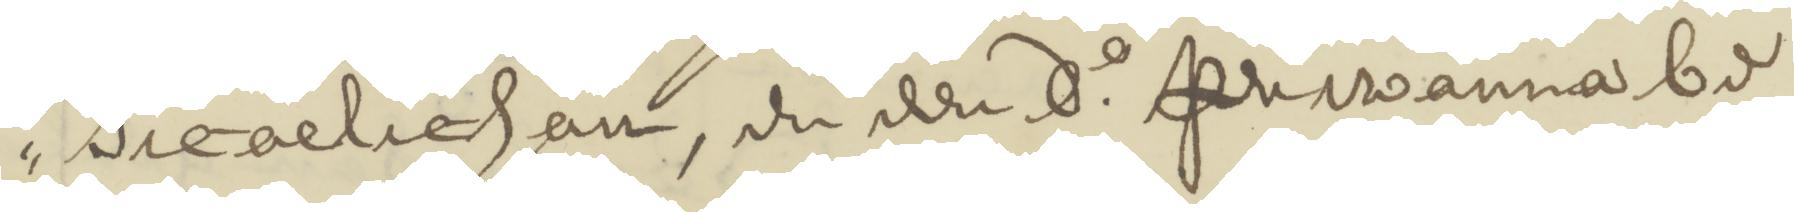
„sicoelichan, en een d.o Per wanna be
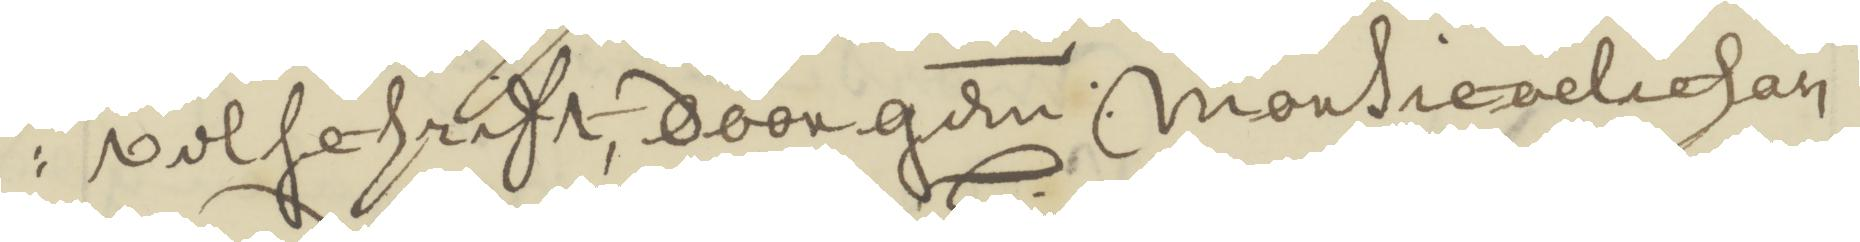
„velschrift, door gem: morsicoelichan
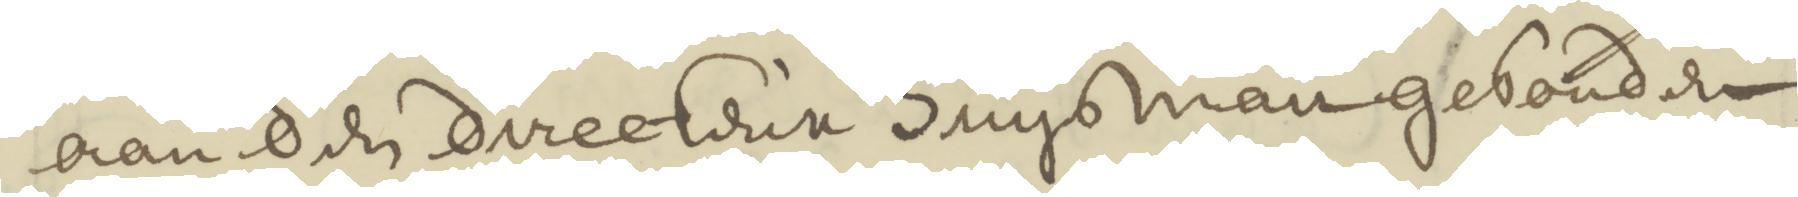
aan den directeur huijsman gesonden
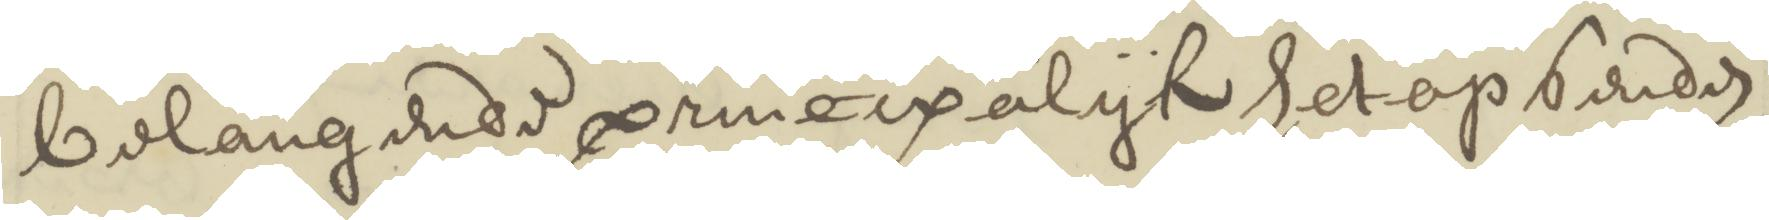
belang ende principalijk het opsenden
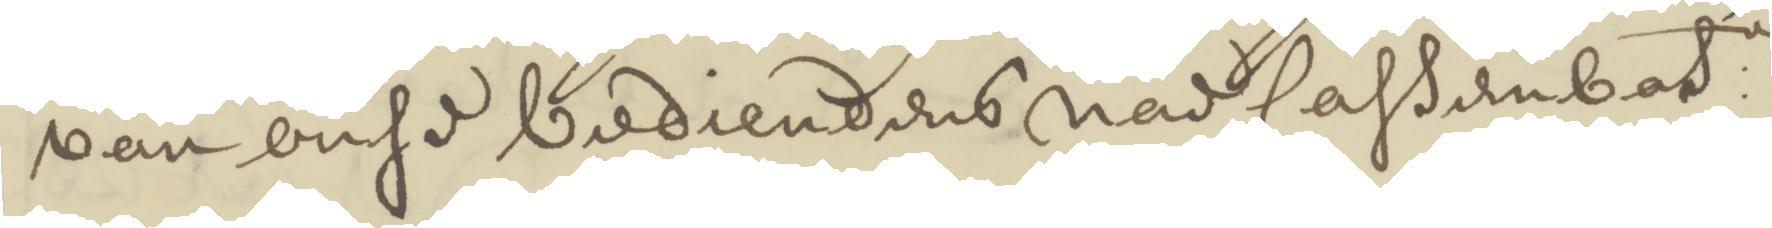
van onse bediendens nae Cassenbos:r
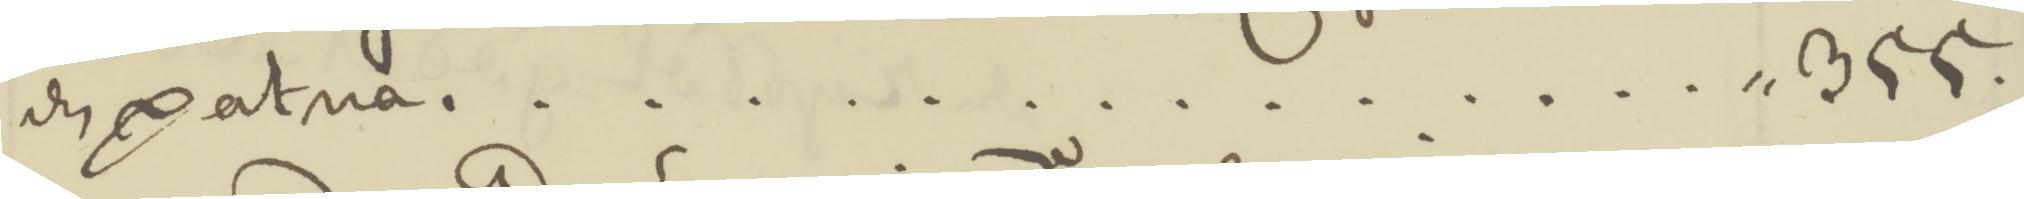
en patna - - - - - - - - - - - - - - - „ 355.
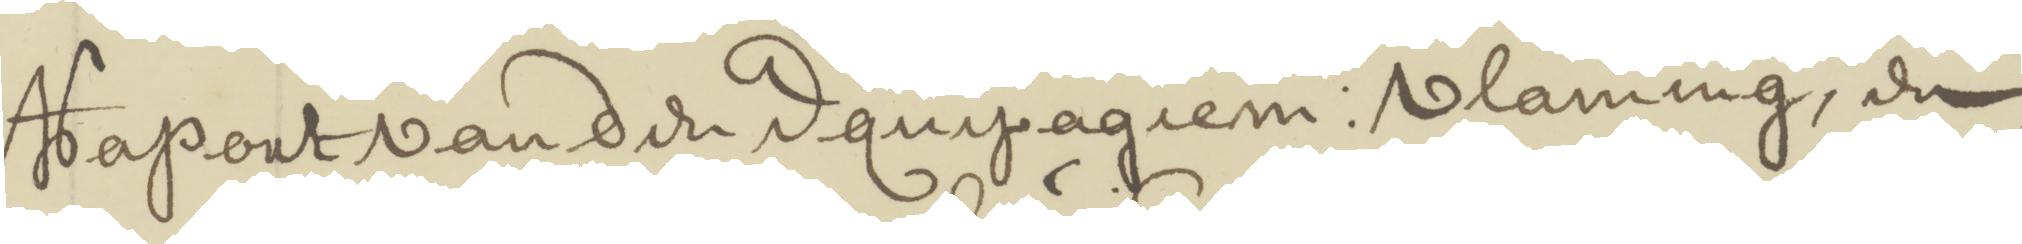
Raport van den Equipagiem:r Vlaming, en
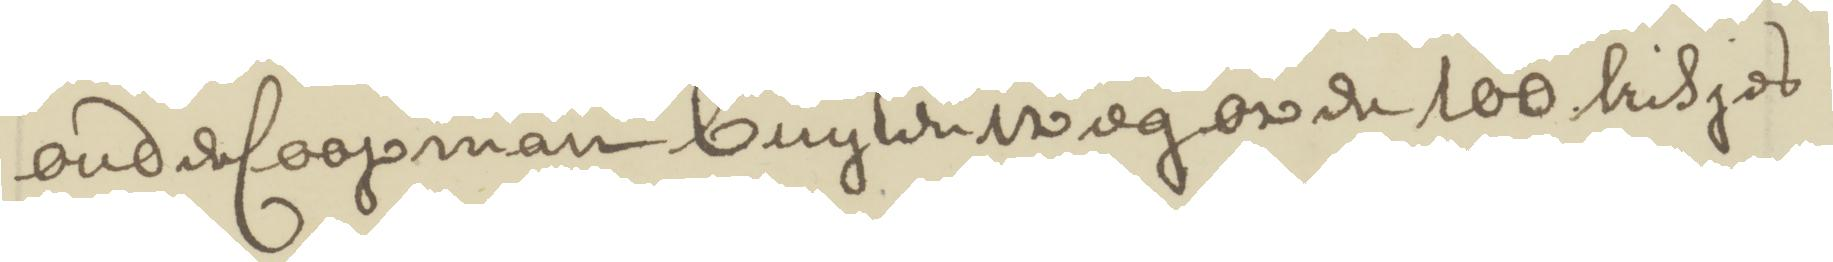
ondercoopman buijtenweg over 100. kisjes
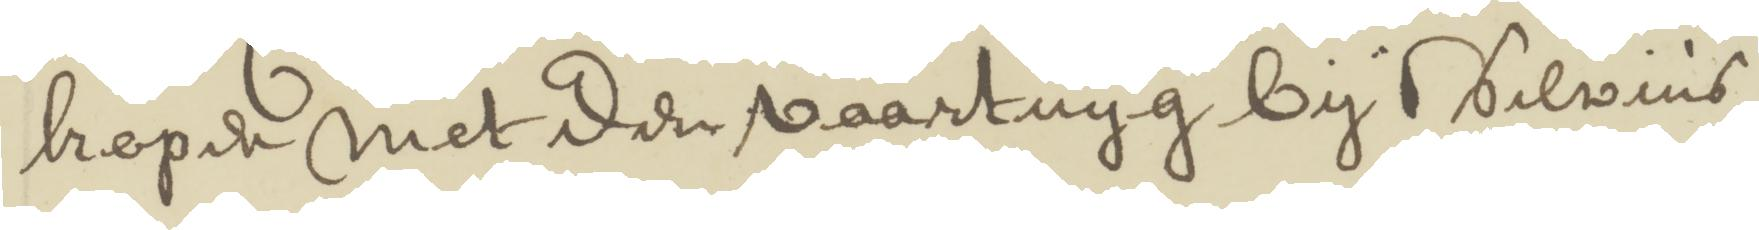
koper met Een vaartuijg bij ’t Silvius
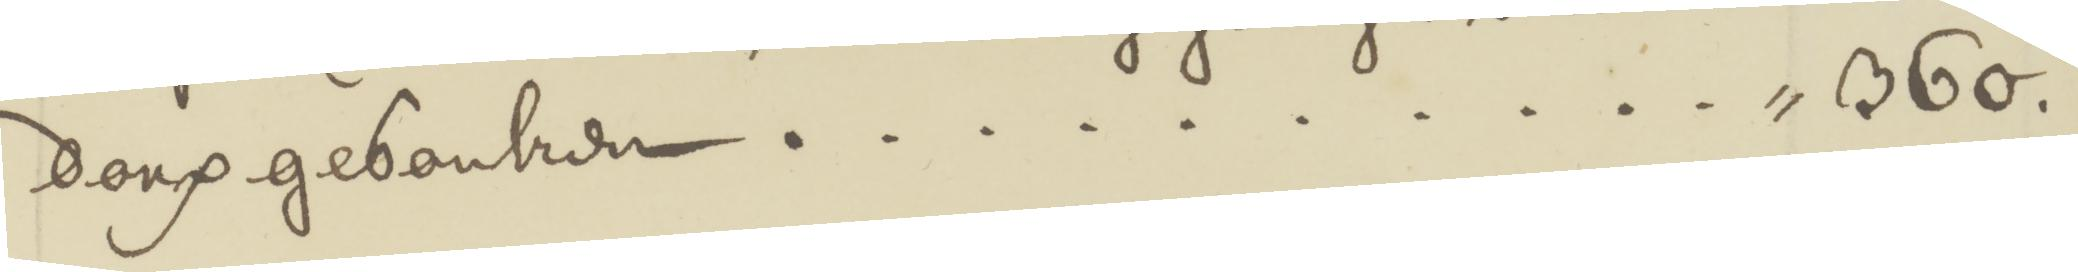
dorp gesonken - - - - - - - - - - „ 360.
